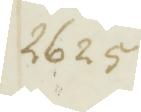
2625
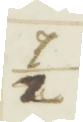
7/2
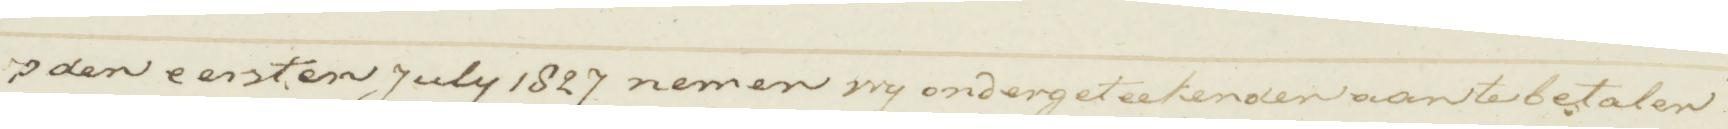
p den eersten July 1827 nemen wy ondergeteekenden aan te betalen
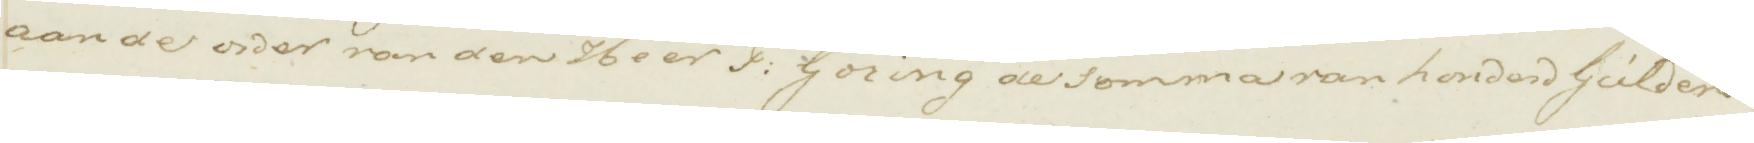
aan de order van den Heer P: Goring de somma van honderd Guldens
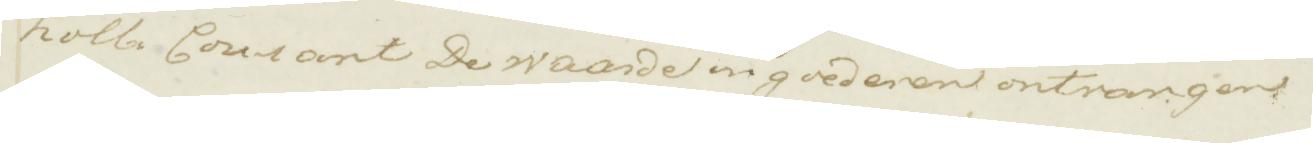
holl„ Courant De waarde in goederen ontvangen
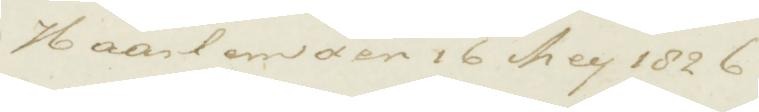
Haarlem den 16 Mey 1826
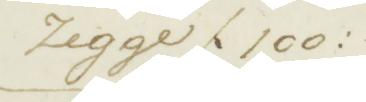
Zegge ƒ 100 : – „ –
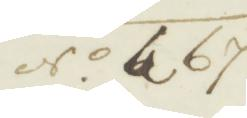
N.o 467
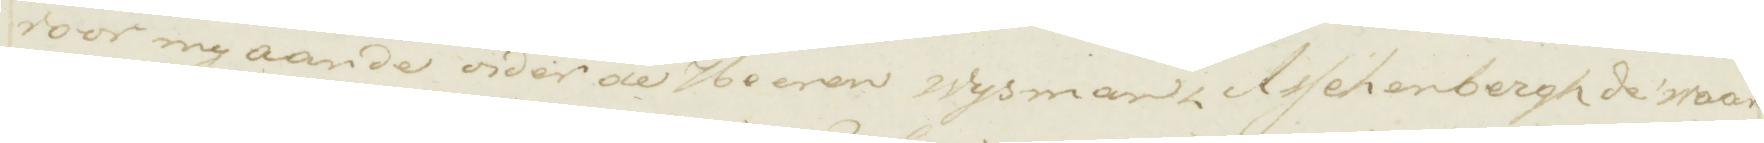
voor wy aan de order de Heeren wysman, Asschenbergh de waar
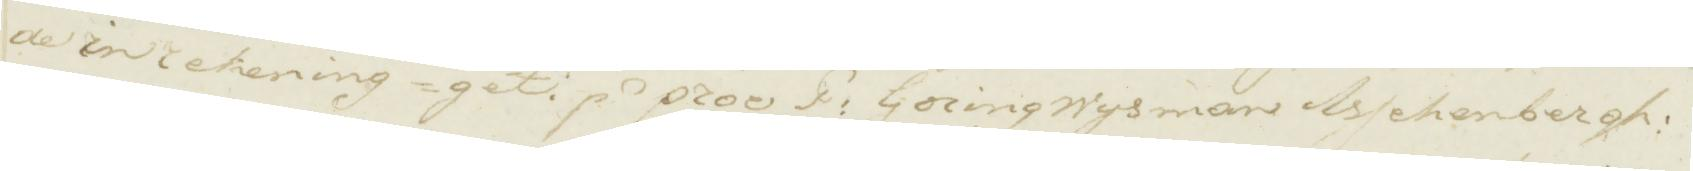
de in rekening =get: po proo P: Goring wysman Asschenbergh:
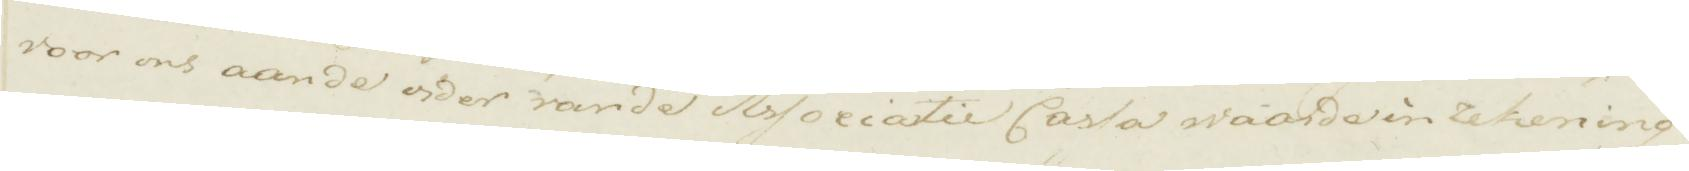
voor ons aan de order van de Associatie Cassa waarde in rekening
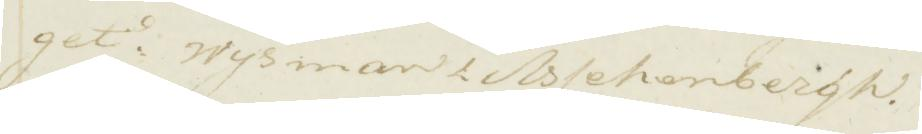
get:' wysman & Asschenberg.
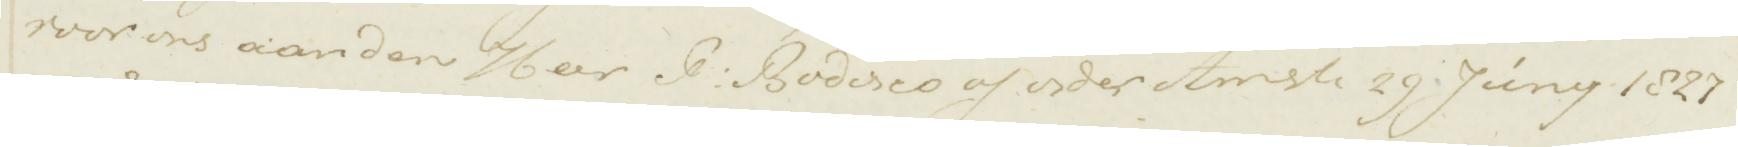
voor ons aan den Heer P: Bodisco of order Amste 29: Juny 1827
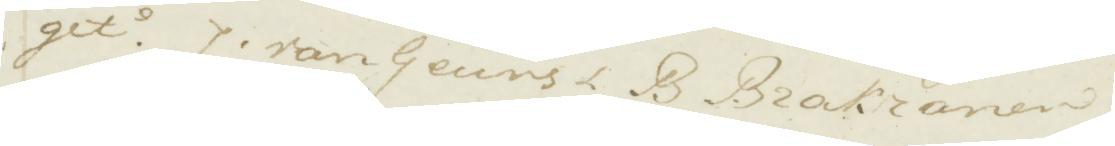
get.' J: van Geurs & B Brakranen.
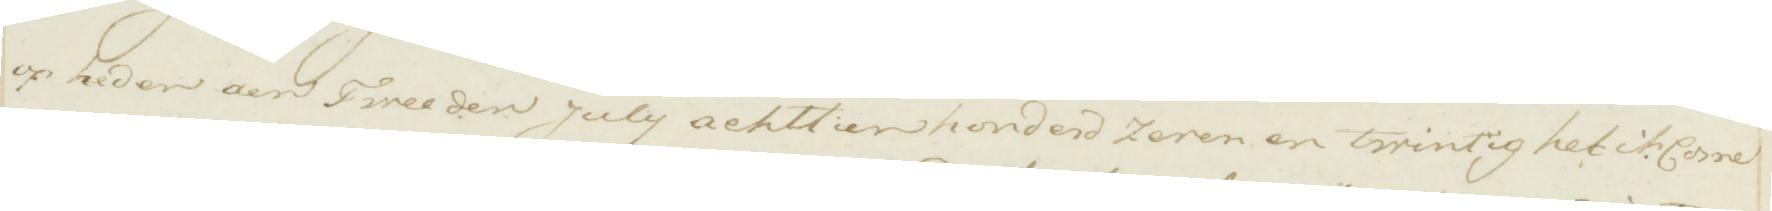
op heden den Tweeden July achttien honderd zeven en twintig heb ik Corne
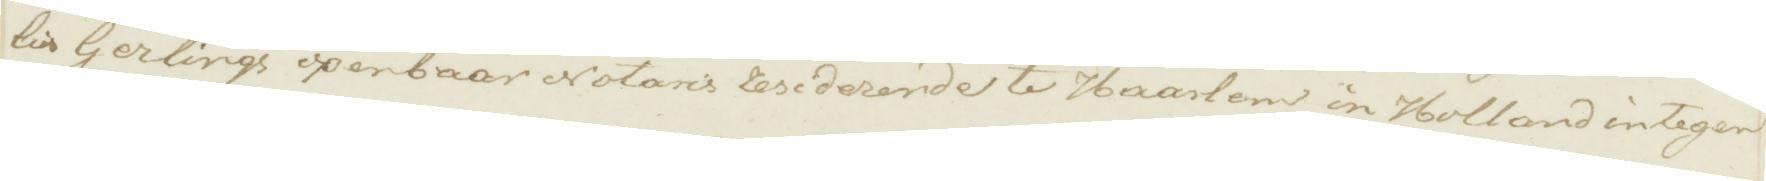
lis Gerlings operbaar Notaris residerende te Haarlem in Holland integen
